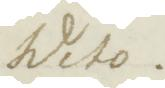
Dito. . . . . . . .
